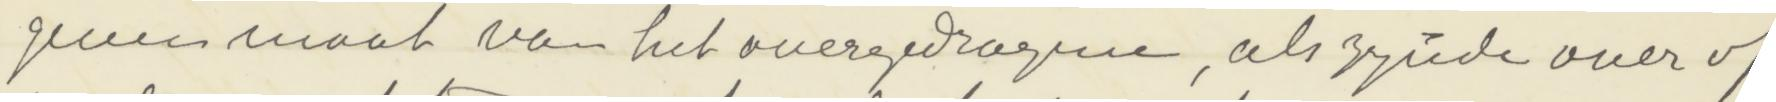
geven maat van het overgedragene, als zijnde over of
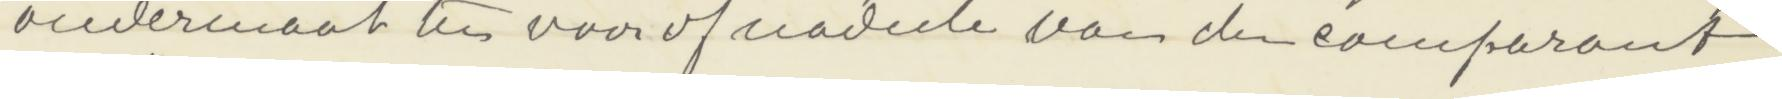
ondermaat ten voor of nadeele van den comparant
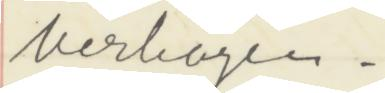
verhogen.
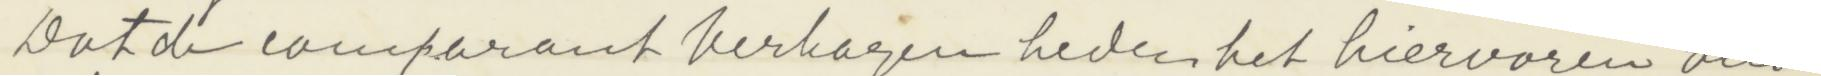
Dat de comparant Verhagen heden het hiervoren om-
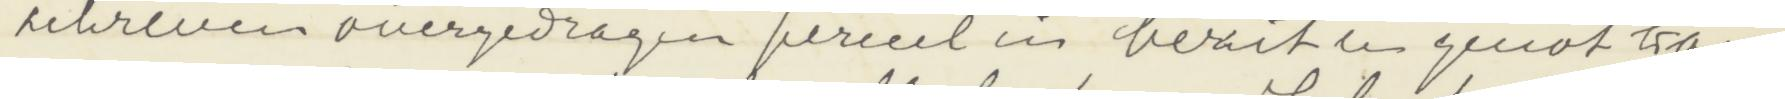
schreven overgedragen perceel in bezit en genot kan
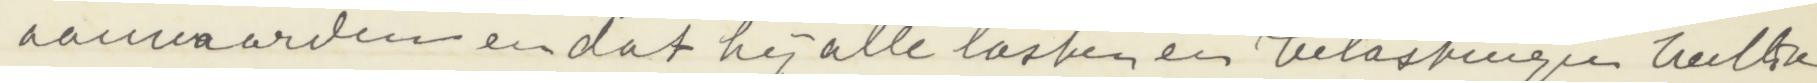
aanvaarden en dat hij alle lasten en belastingen welke
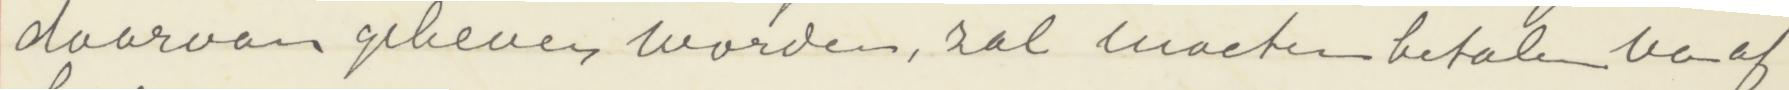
daarvan geheven worden, zal moeten betalen vanaf
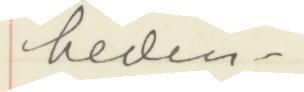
heden-
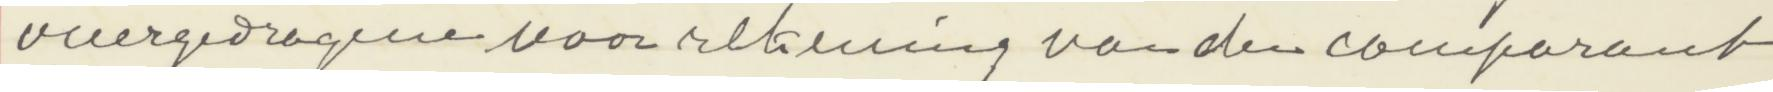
overgedragene voor rekening van den comparant
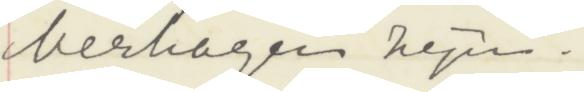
Verhagen zijn.
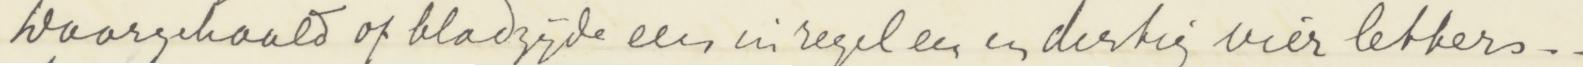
Doorgehaald op bladzijde een in regel een en dertig vier letters-
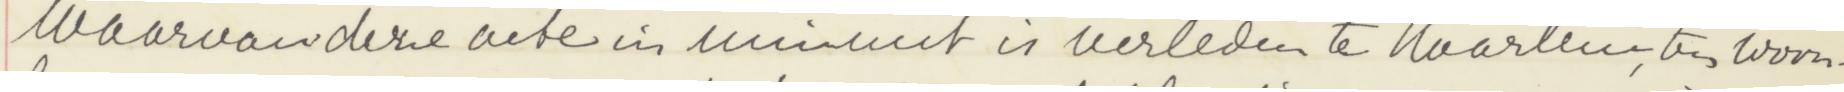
Waarvan deze acte in minuut is verleden te Haarlem, ten woon
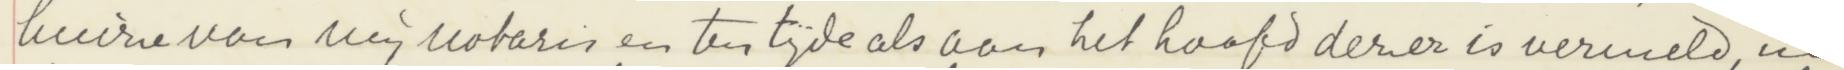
huize van mij notaris en ten tijde als aan het hoofd dezer is vermeld, in
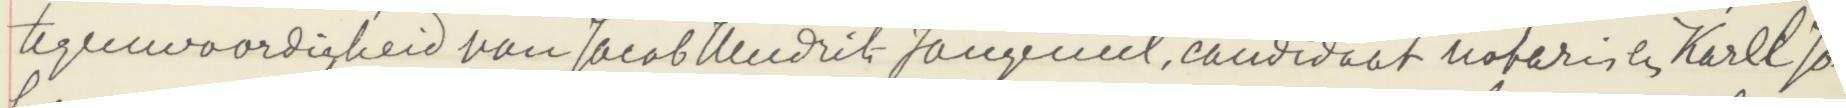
tegenwoordigheid van Jacob Hendrik Jongeneel, candidaat notaris en Karel Jo.
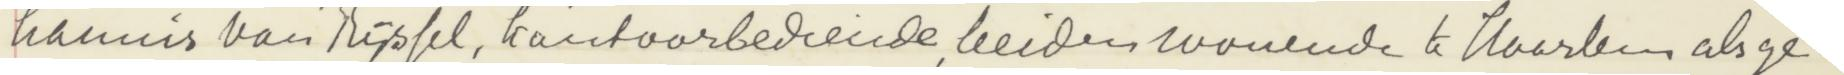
hannis van Rijssel, kantoorbediende, beiden wonende te Haarlem als ge-
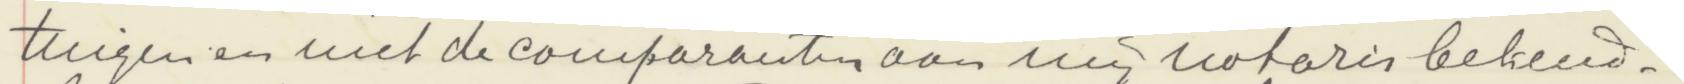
tuigen en met de comparanten aan mj notaris bekend.
